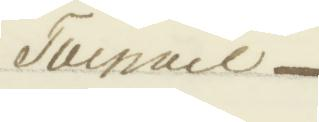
Toepoel
